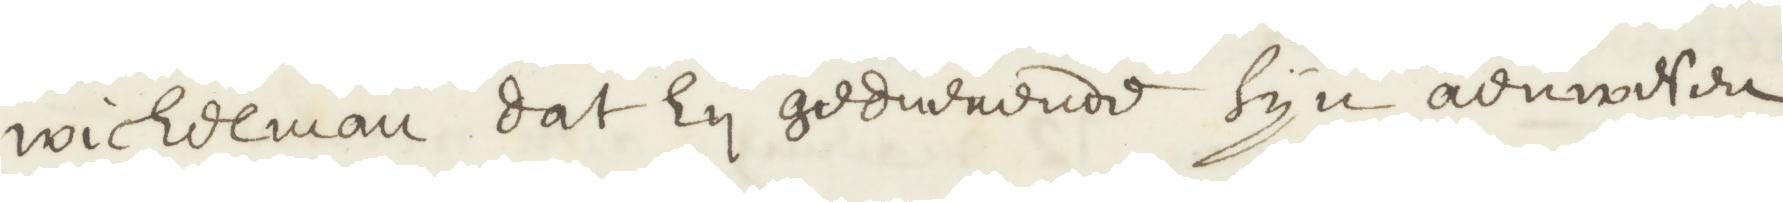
wichelman dat hij geduerende sijn aenwesen
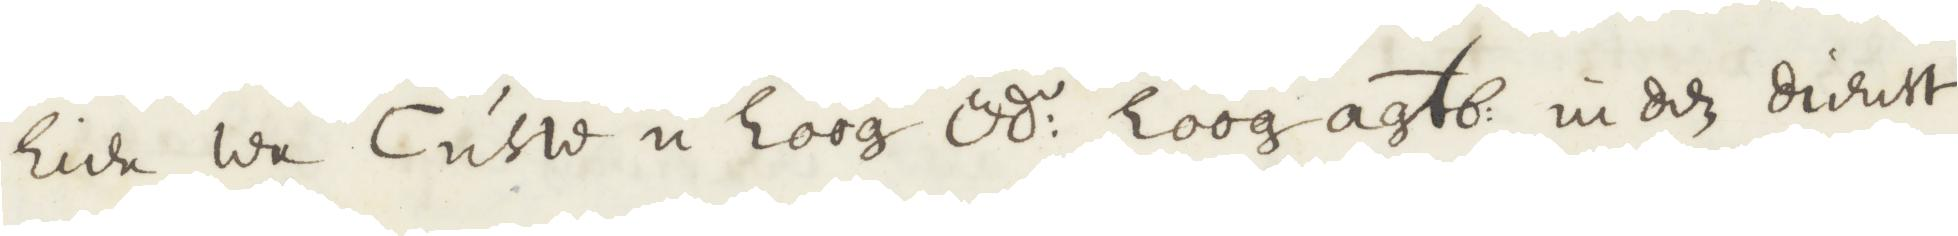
hier ter Custe u hoog Ed: hoog agtb: in den dienst
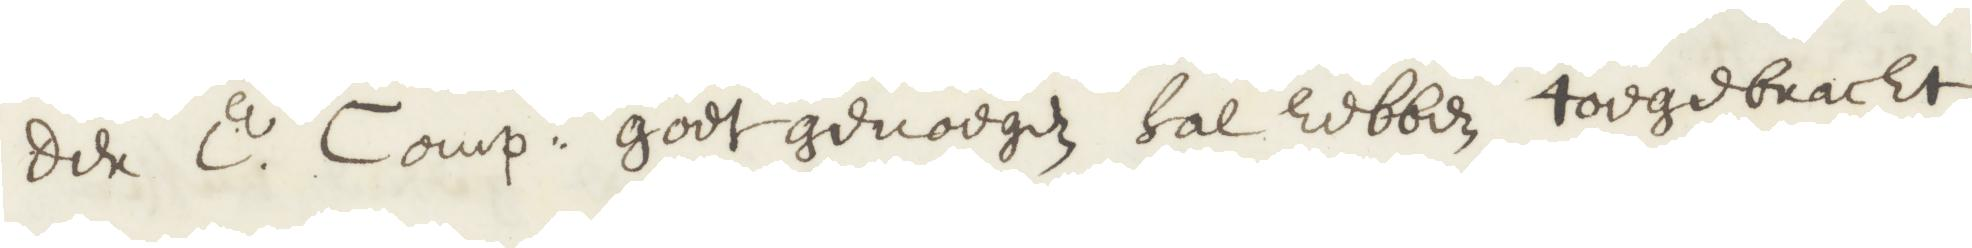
der E: Comp„s goet genoegen sal hebben toegebracht
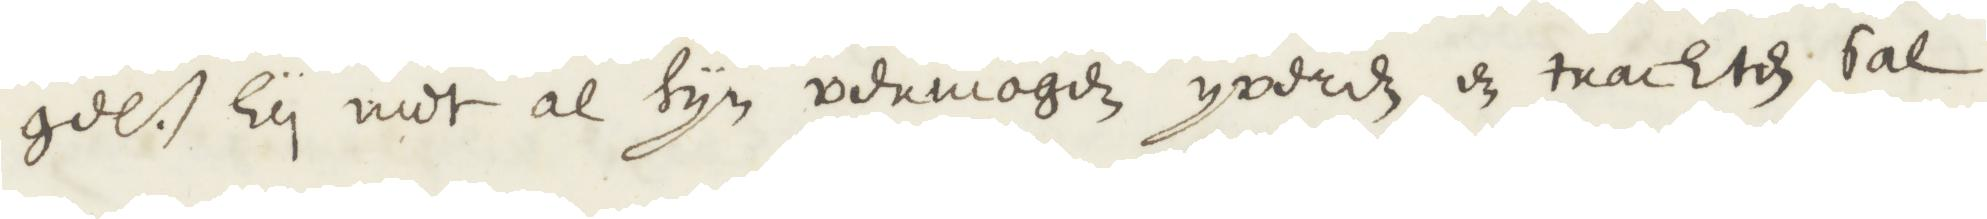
gelijk hij met al sijn vermogen ijveren en trachten sal
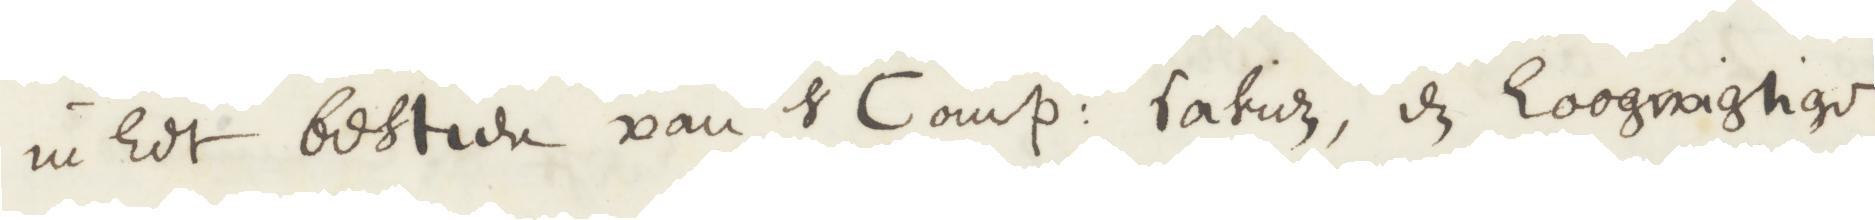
in het bestier van ’s Comp:s saken, en hoogwigtige
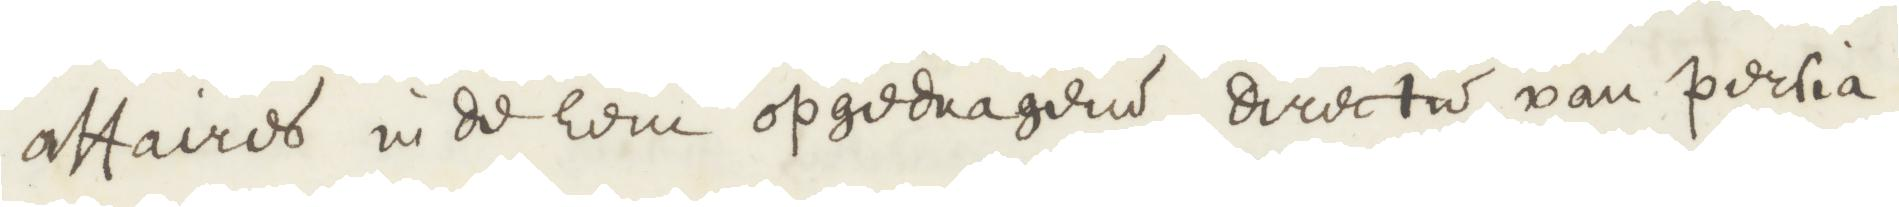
affaires in de hem opgedragene directie van persia
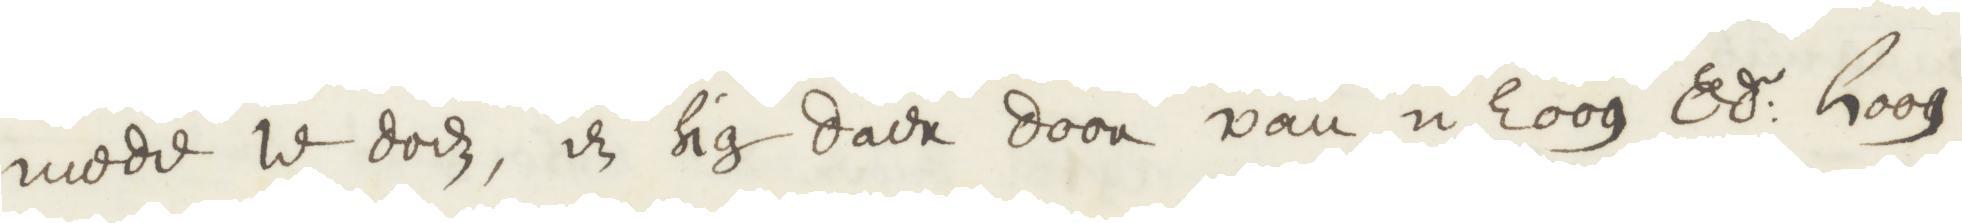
mede te doen, en sig daer door van u hoog Ed:e hoog
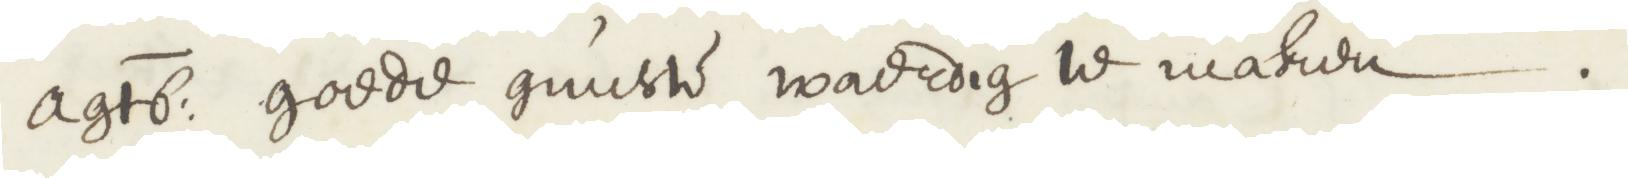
agtb: goede gunste waerdig te maken.
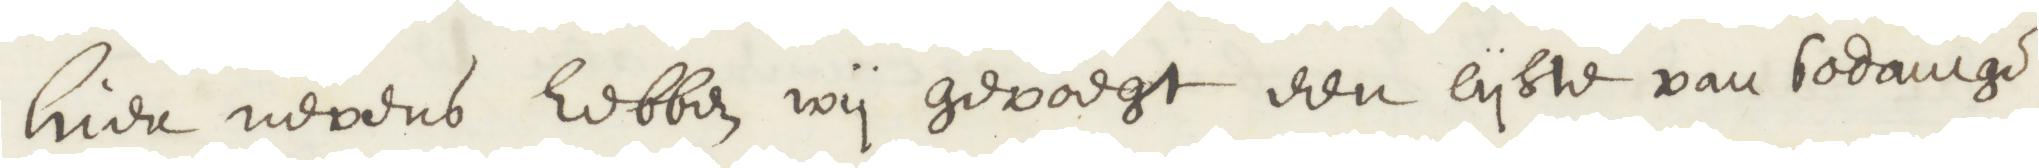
hier nevens hebben wij gevoegt een lijste van sodanige
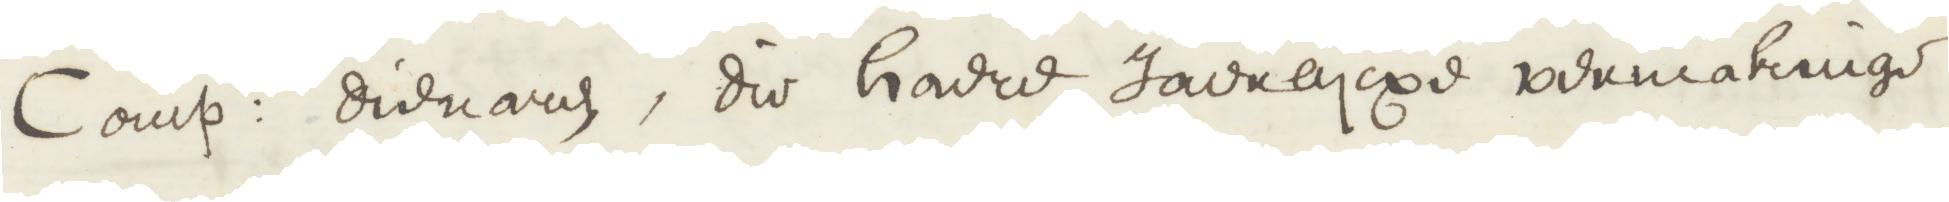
Comp:s dienaren, die haere Iaerlijcxe vermakinge
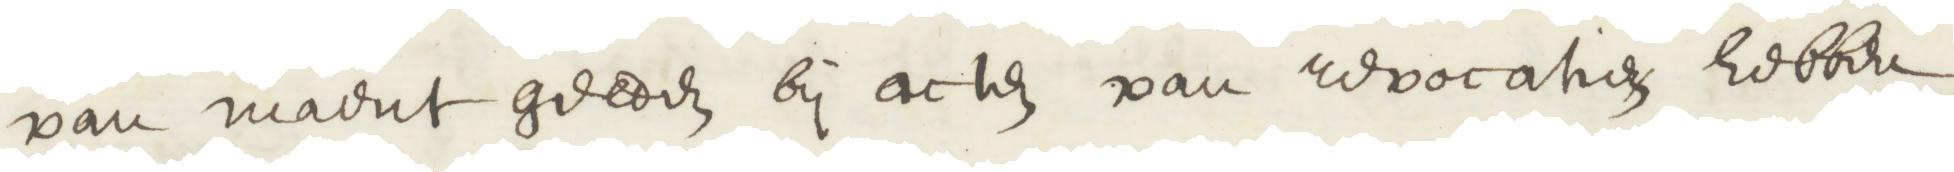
van maent gelden bij acten van revocatien hebben
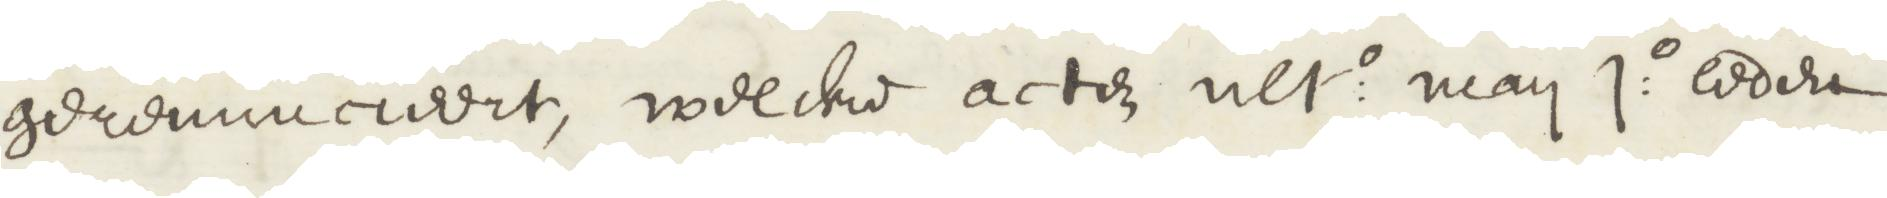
gerenuncieert, welcke acten ult:o maij j:o leden
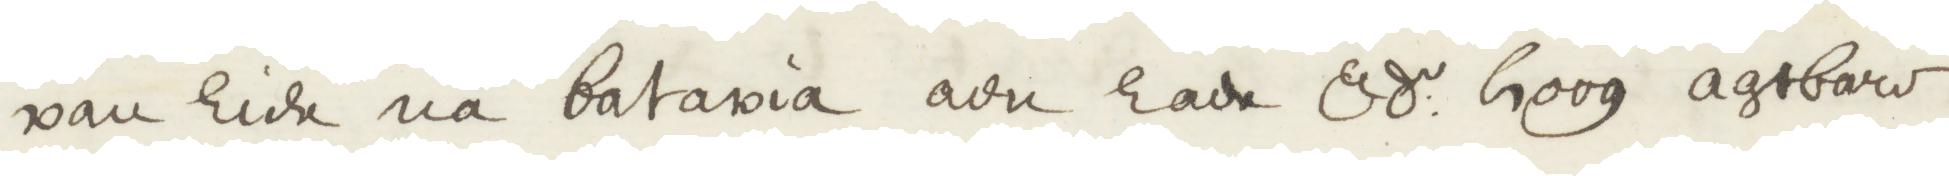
van hier na batavia aen haer Ed:e hoog agtbare
